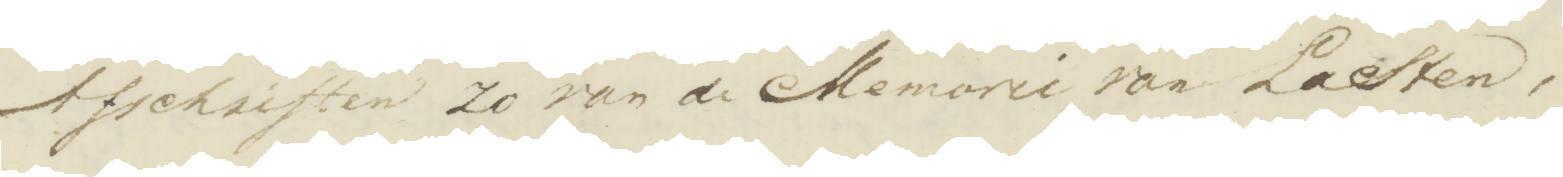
Afschriften zo van de Memorie van Lasten,
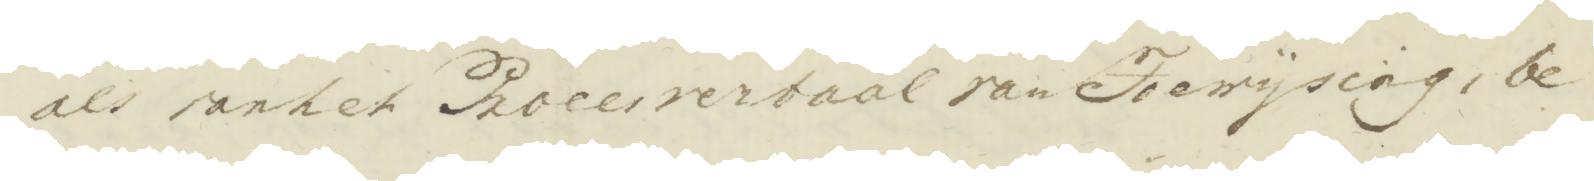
als van het Proces verbaal van Toewijsing, be
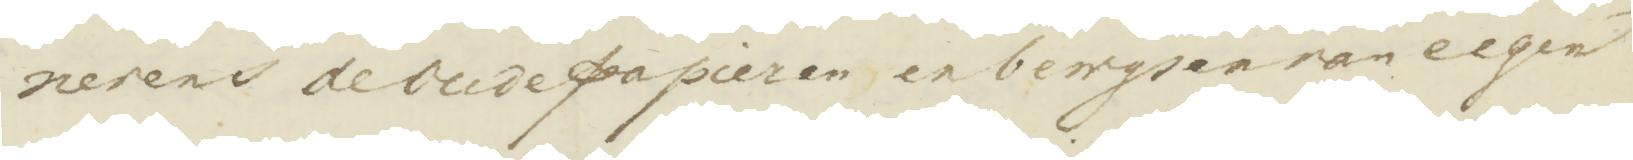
nevens de oude papieren en bewijsen van eigen
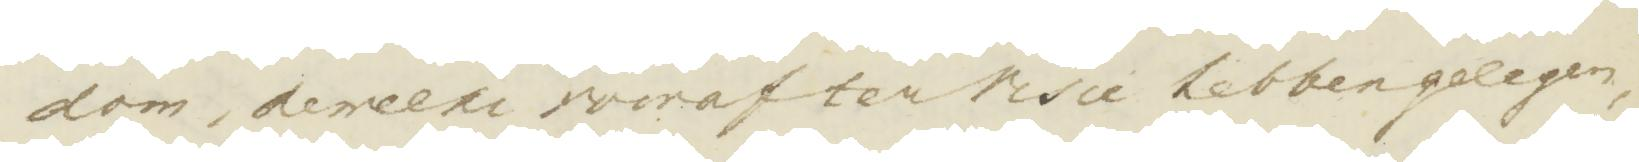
dom, dewelke vooraf ter visie hebben gelegen,
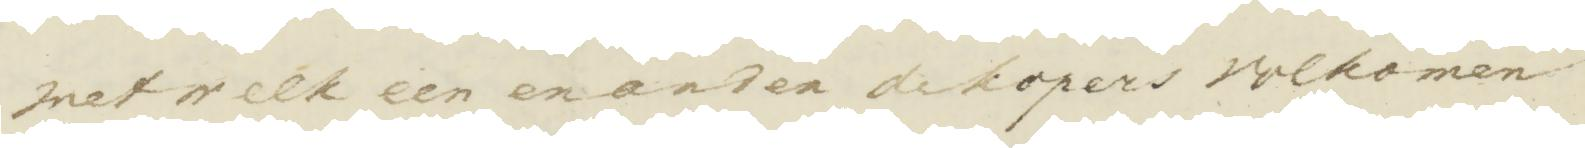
met welk een en ander de kopers volkomen
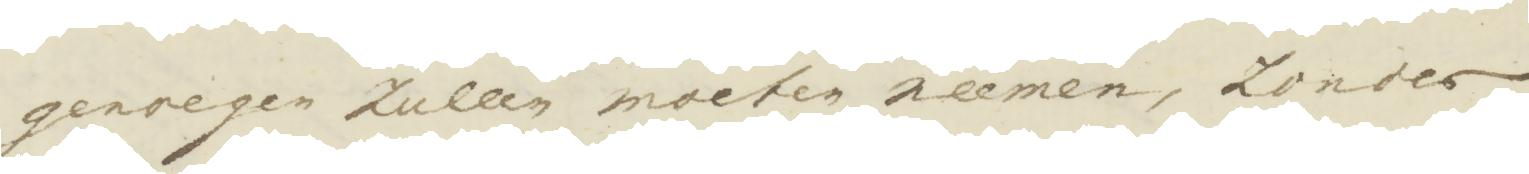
genoegen zullen moeten neemen, zonder
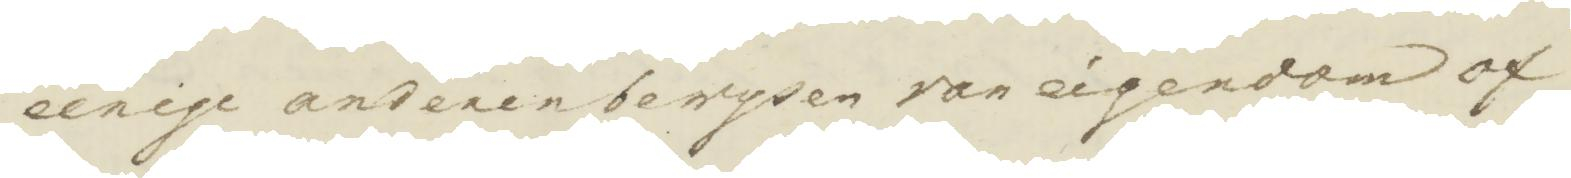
eenige anderen bewysen van eigendom of
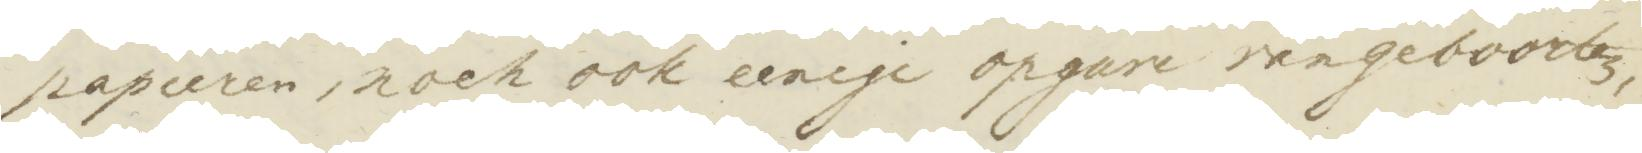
papieren, noch ook eenige opgave van geboorten,
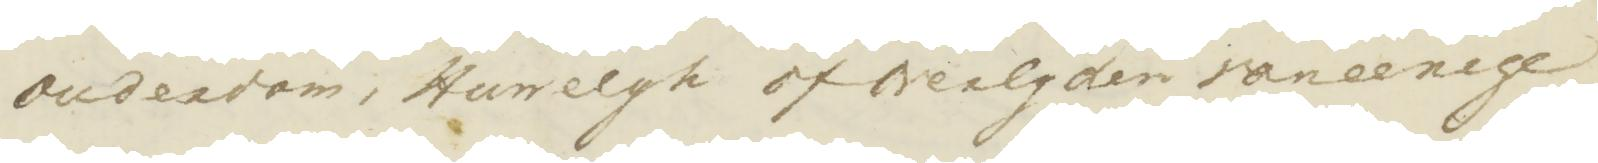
ouderdom, huwelyk of overlyden van eenige
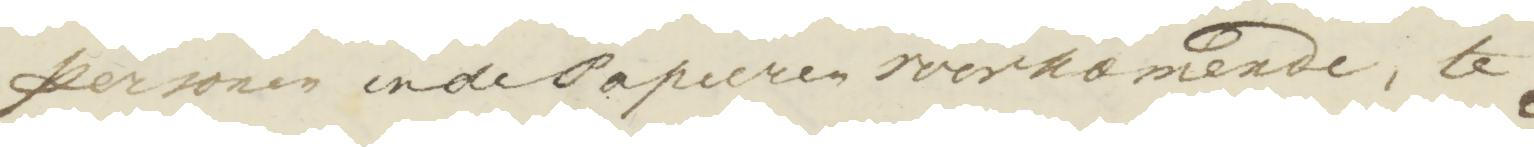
personen in de Papieren voerkomende, te
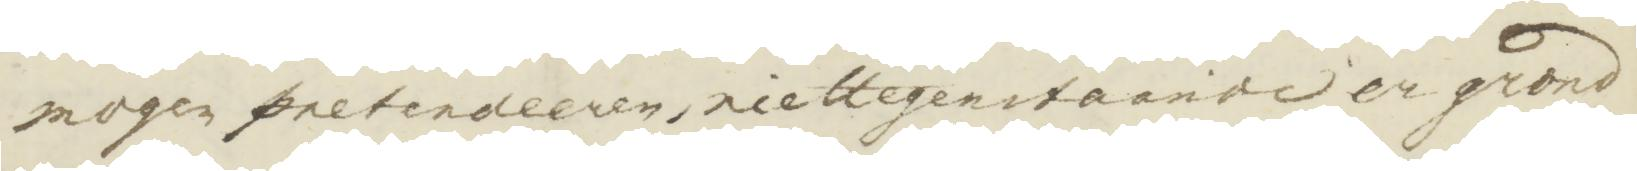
mogen pretendeeren, niettegenstaande er grond
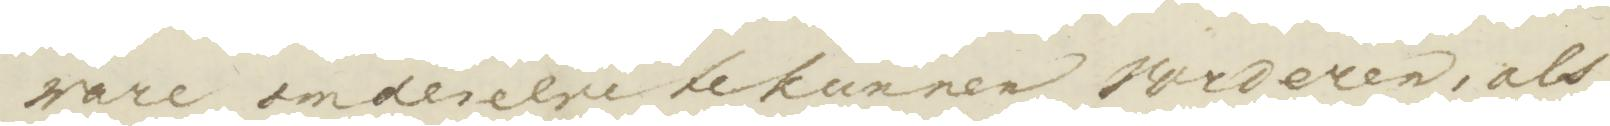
ware om deselve te kunnen vorderen, als
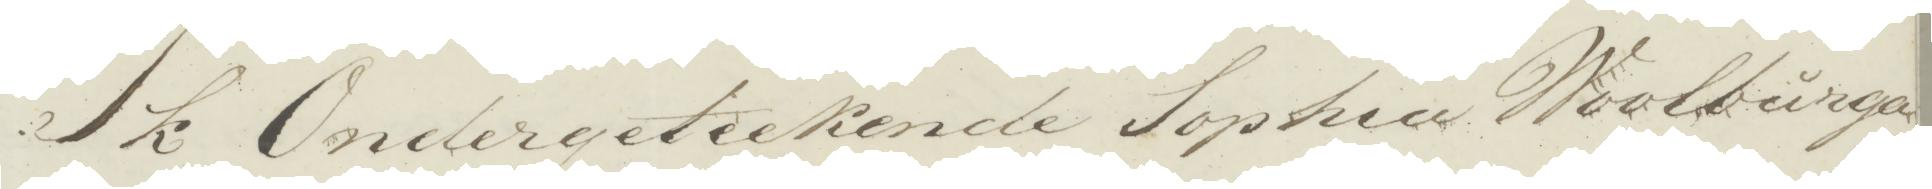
Ik Ondergeteekende Sophia Woolburga
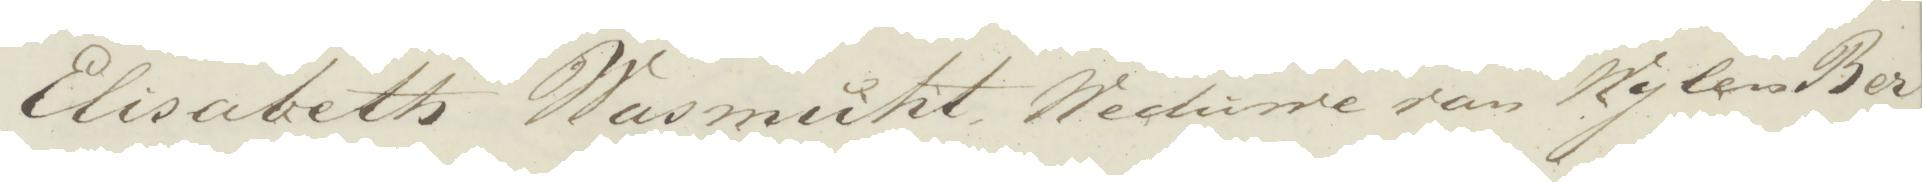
Elisabeth Wasmuht weduwe van wylen Ber
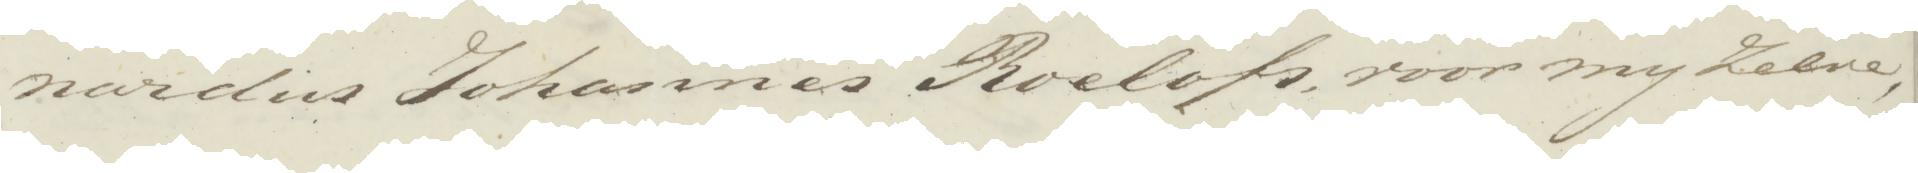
nardus Johannes Roelofs, voor my zelve,
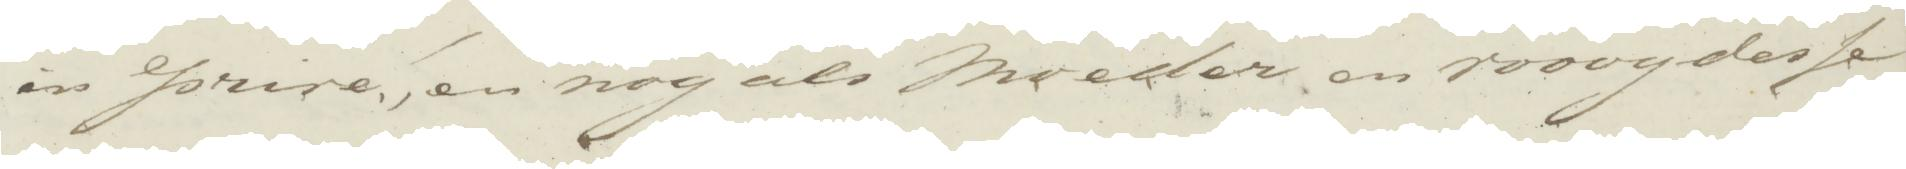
in privé, en nog als moeder en vooogdesse
